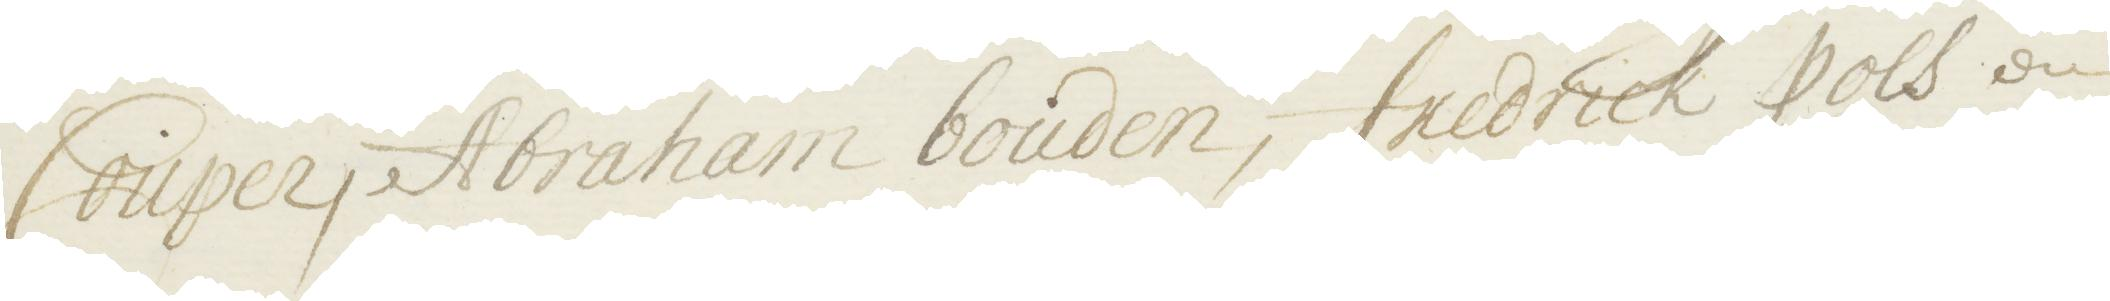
Couper, Abraham bouden, fredrick pols en
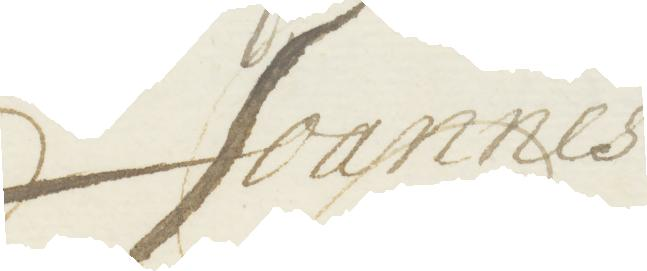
Joannes
